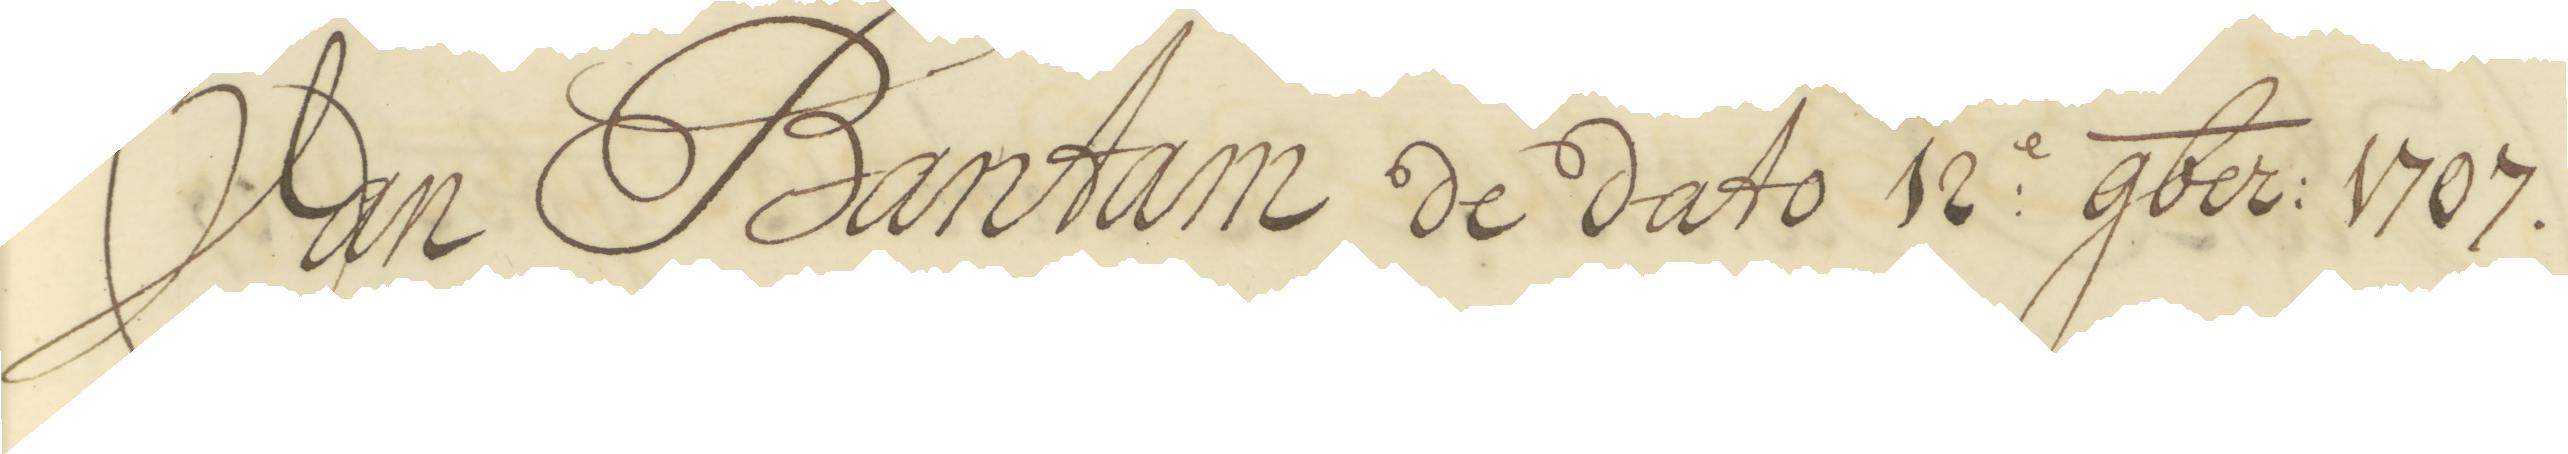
Van Bantam de dato 12:e 9ber: 1707.
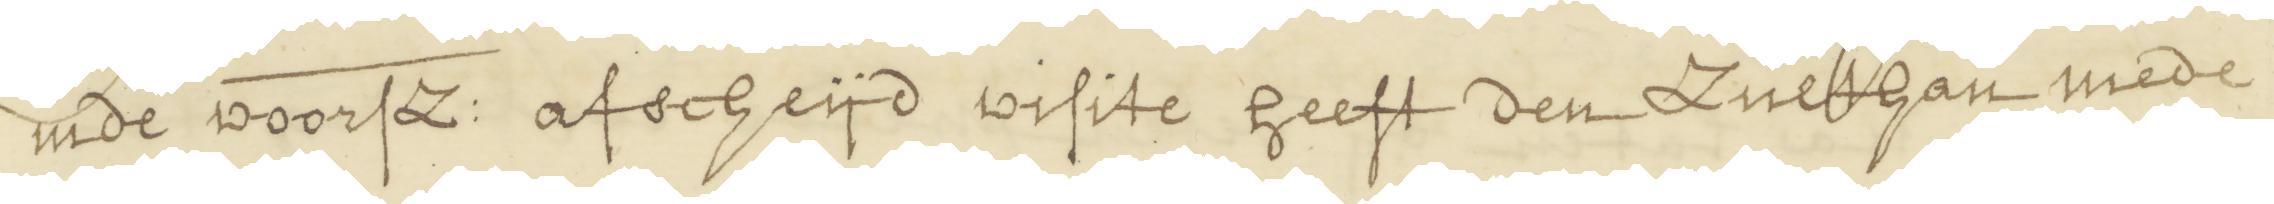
inde voorsz: afscheijd visite heeft den zulthan mede
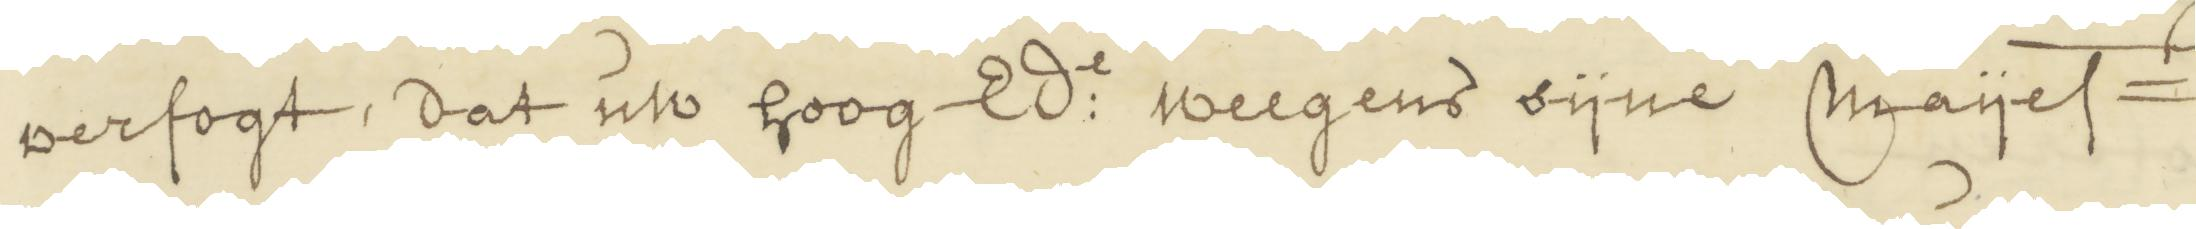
versogt, dat uw hoog Ed:e weegens sijne maijes=t
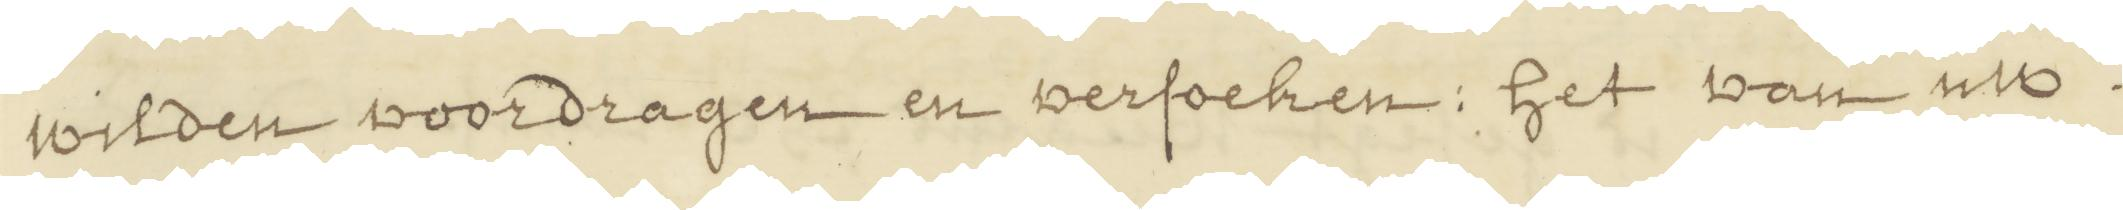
wilden voordragen en versoeken: het van uw
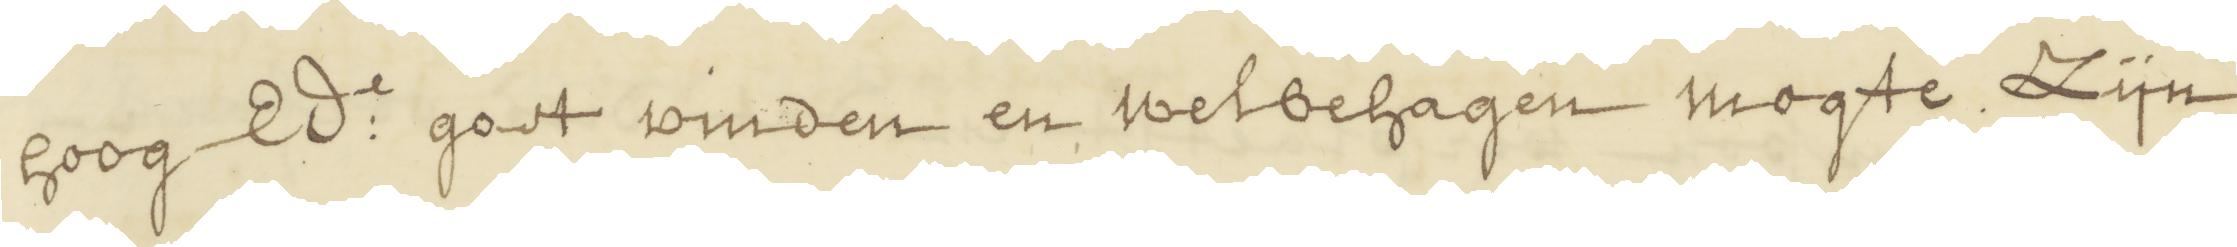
hoog Ed:e goet vinden en welbehagen mogte zijn
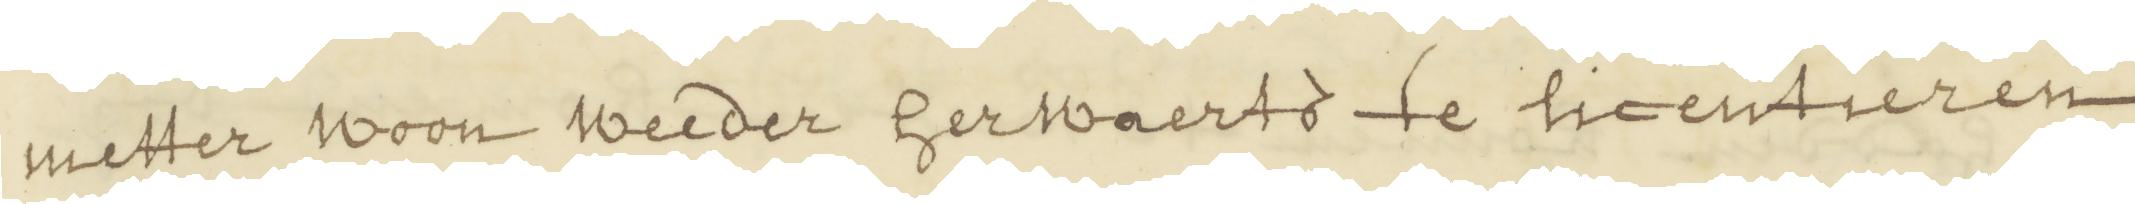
metter woon weeder herwaerts te licentieren
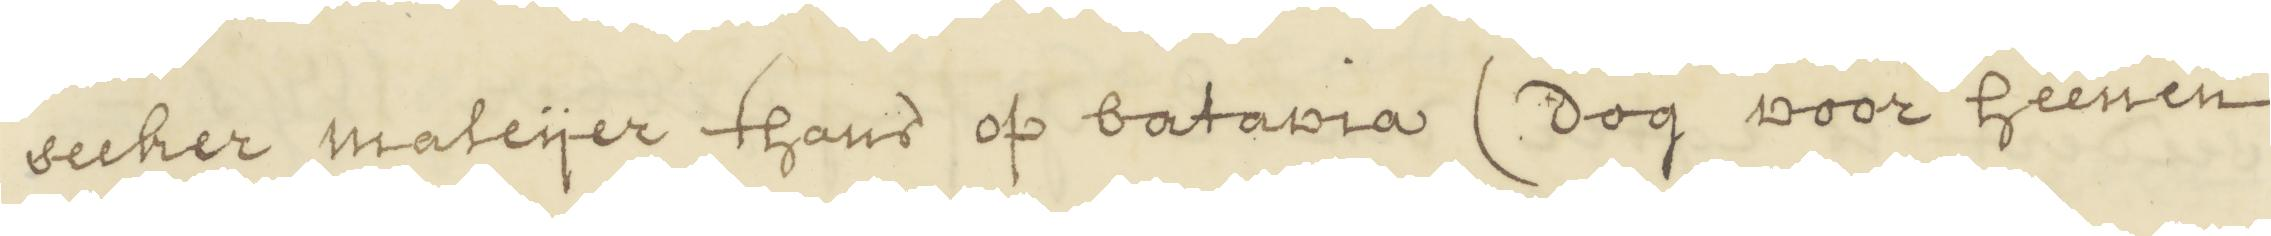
seeker maleijer thans op batavia (dog voor heenen
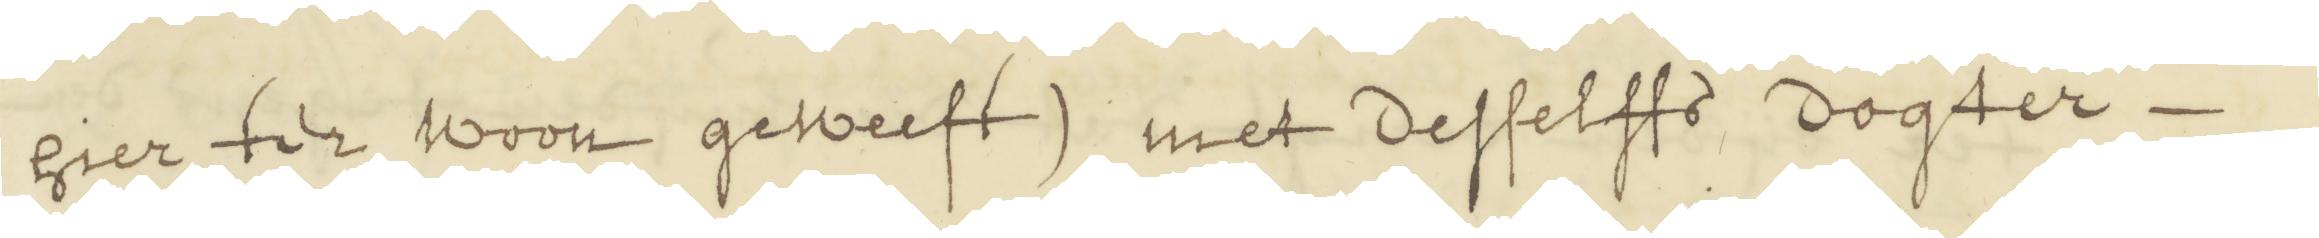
hier ter woon geweest) met desselffs dogter —
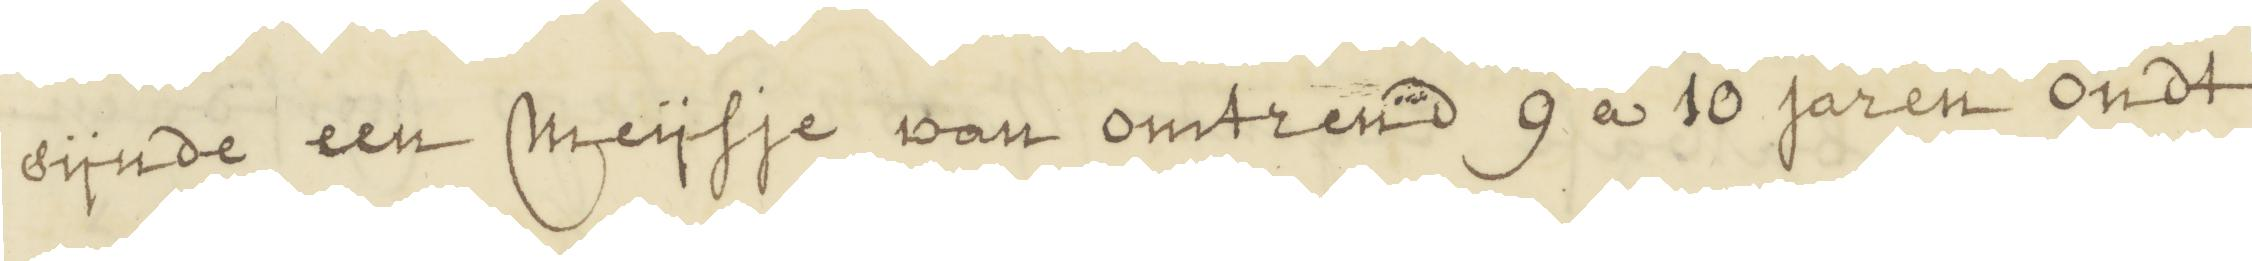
sijnde een meijsje van omtrend 9 a 10 jaren oudt
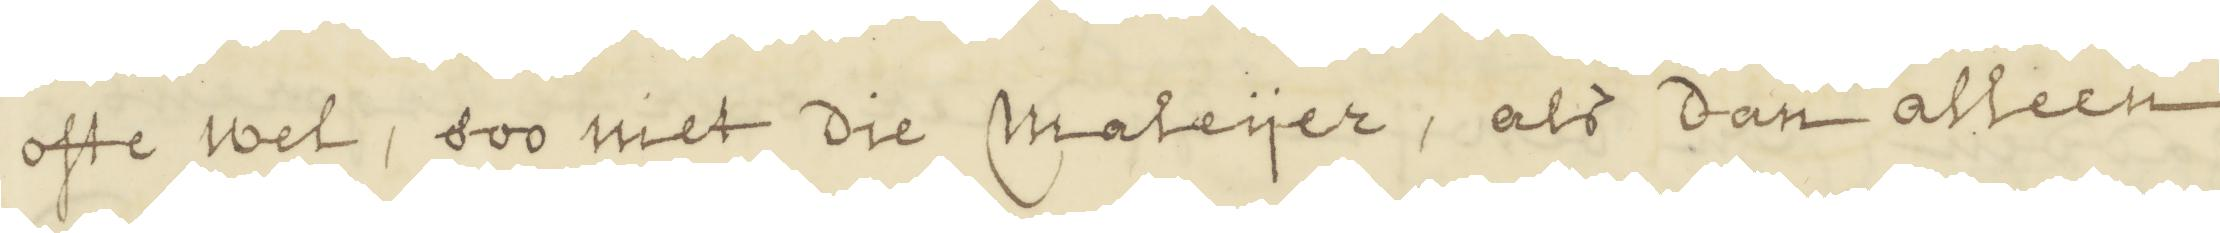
ofte wel, soo met die maleijer, als dan alleen
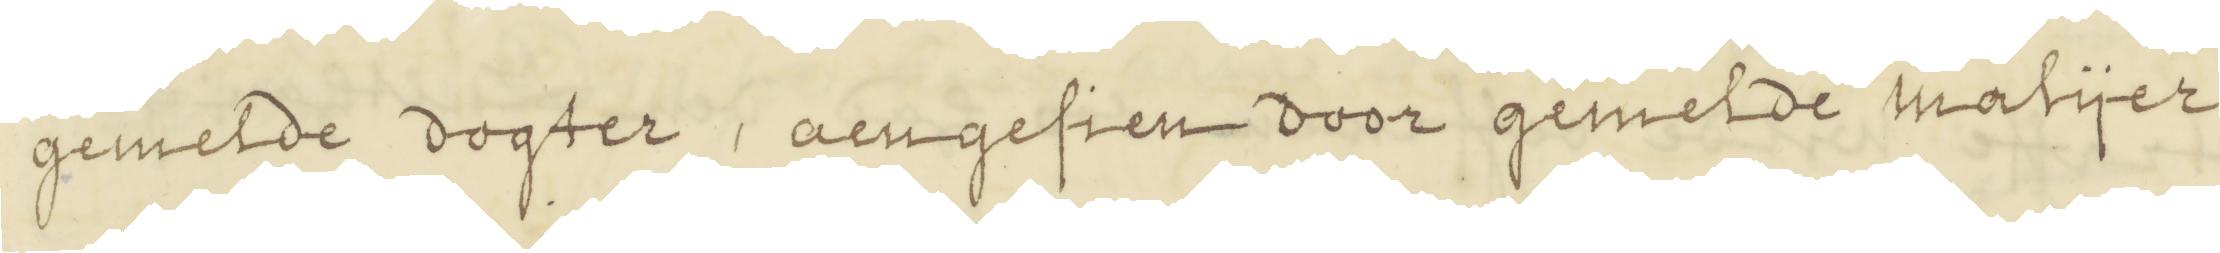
gemelde dogter, aengesien door gemelde malijer
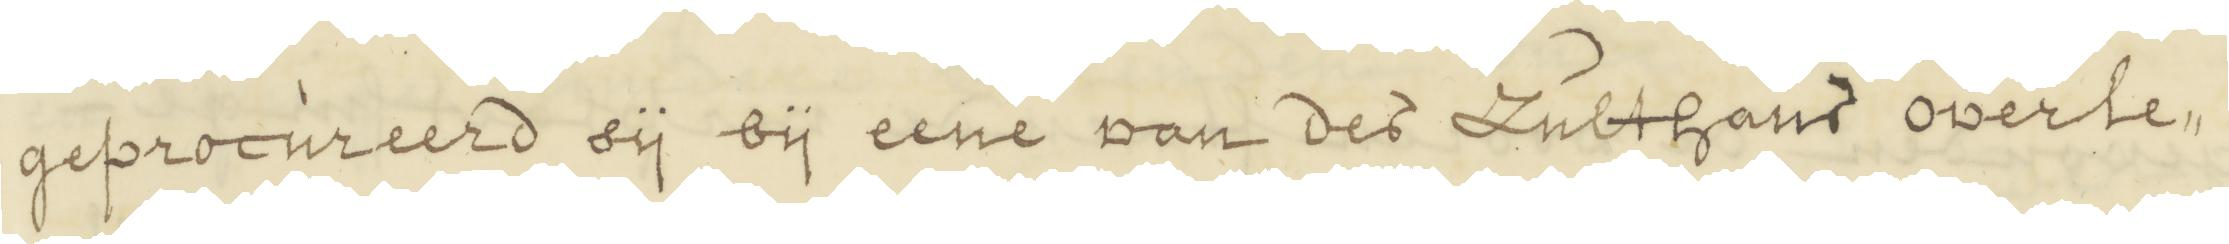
geprocureerd sij bij eene van des zulthans overle„
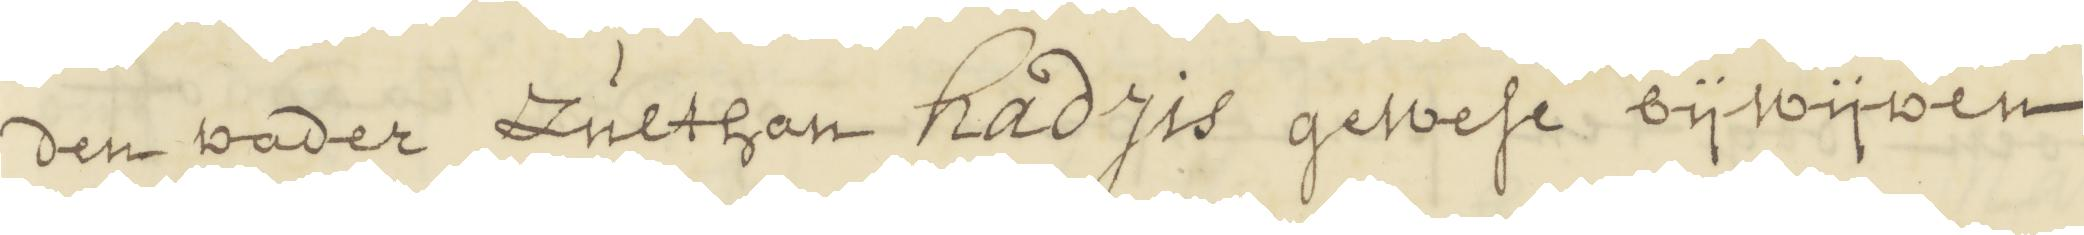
den vader zulthan hadjis gewese bijwijven
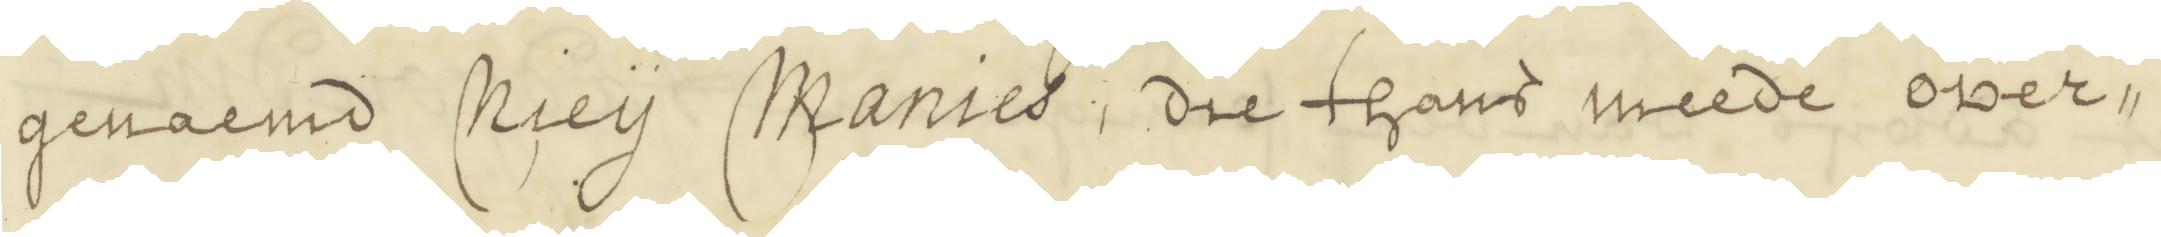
genoemd Nieij Manies; die thans meede over„
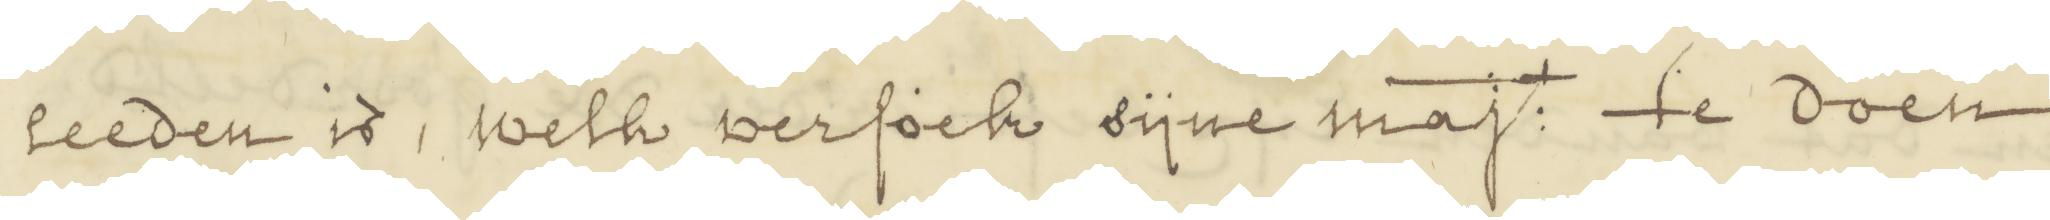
leeden is, welk versoek sijne maj:t te doen
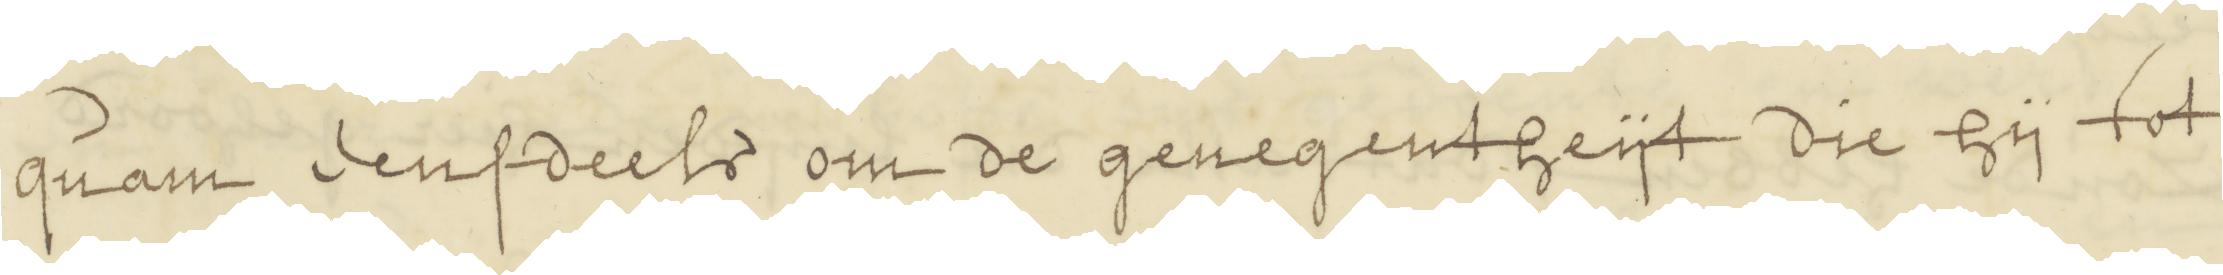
quam een sdeels om de genegentheijt die hij tot
